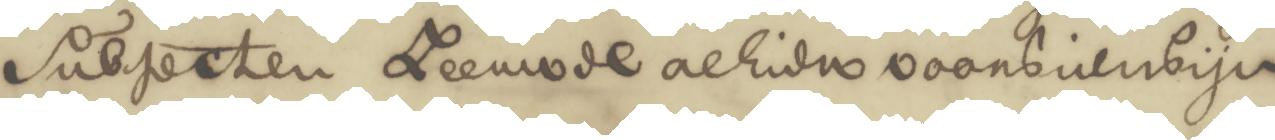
subjecten zeerwel alhier voorsiensijn
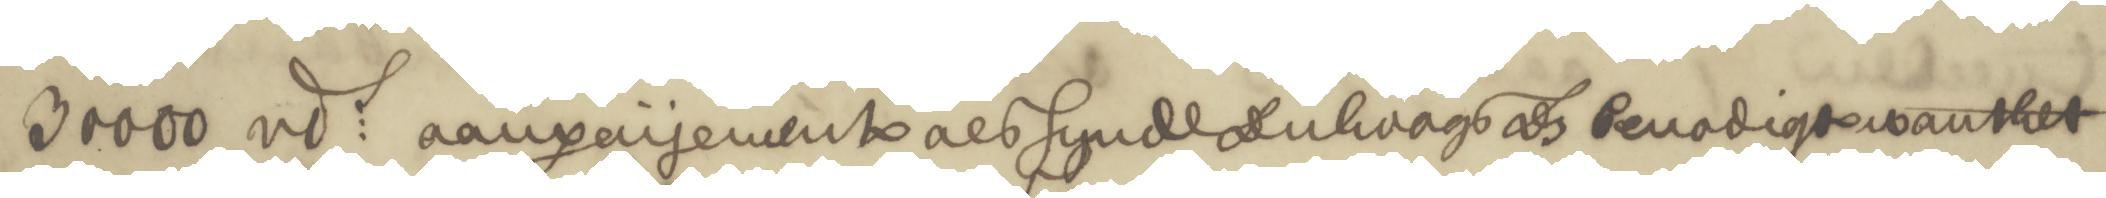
30000 rd:s aan paijement als synde ten hoogsten benodigt wanthet
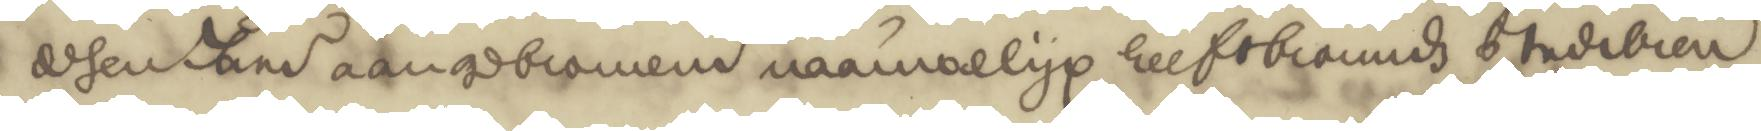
desen Jare aan gekomene naauwelijx heeft konnen strecken
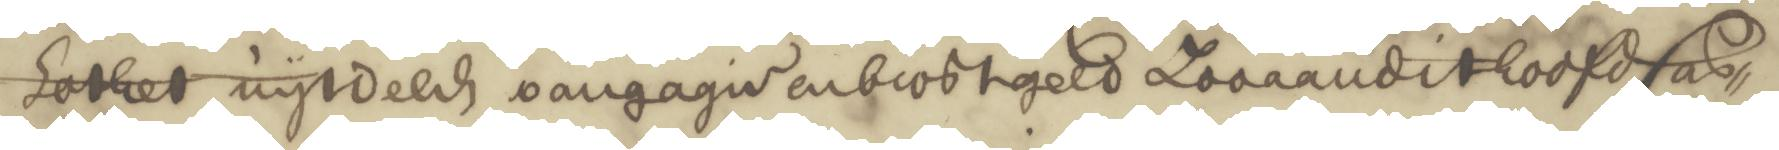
tothet uijtdelen vangagie en kostgeld zooaan dit hoofd Cas„
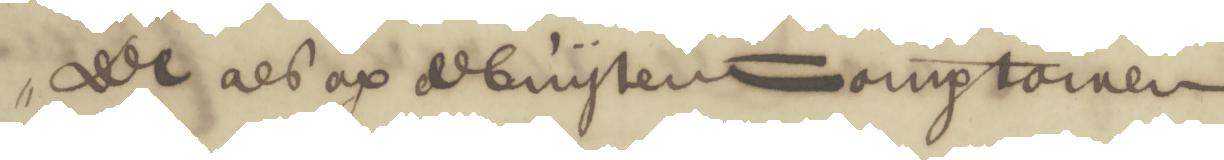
„teel als op de buijten comptoiren
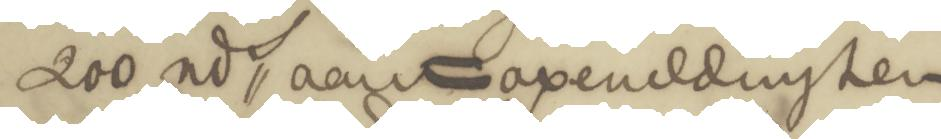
200 rd„s aan copereduyten
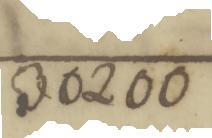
30200
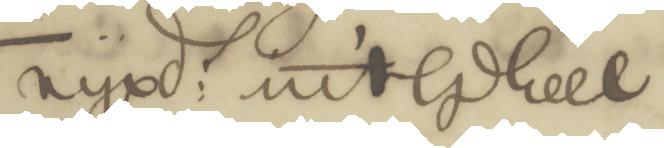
rijxd:s in 't geheel
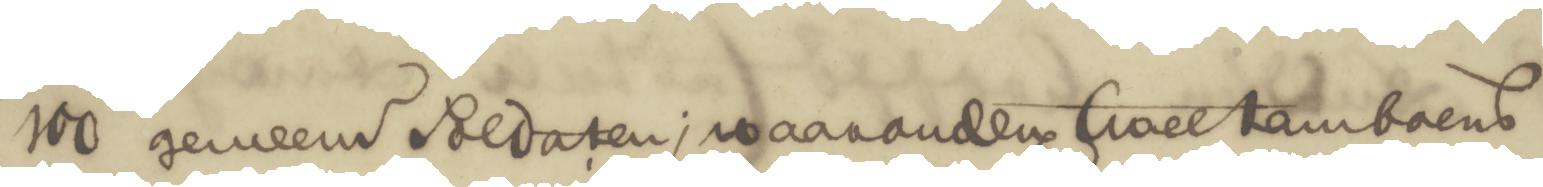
100 gemeene soldaten; waaronder twee tamboers
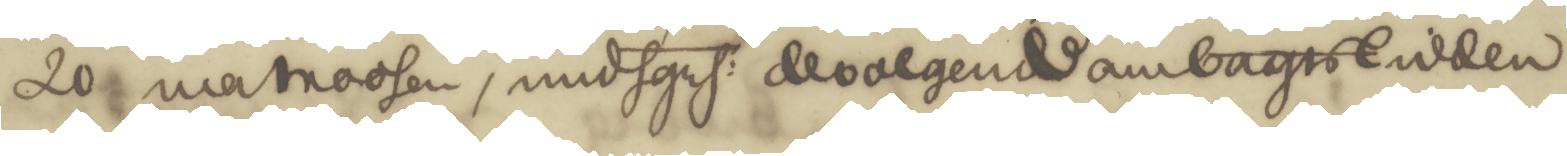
20 matroosen, midsgrs: devolgende ambagtslieden
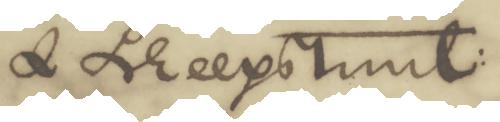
2 scheepstiml:
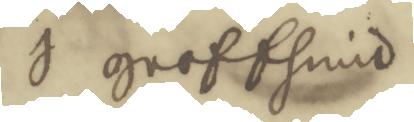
1 groffsmid
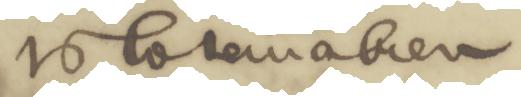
1 slotemaker
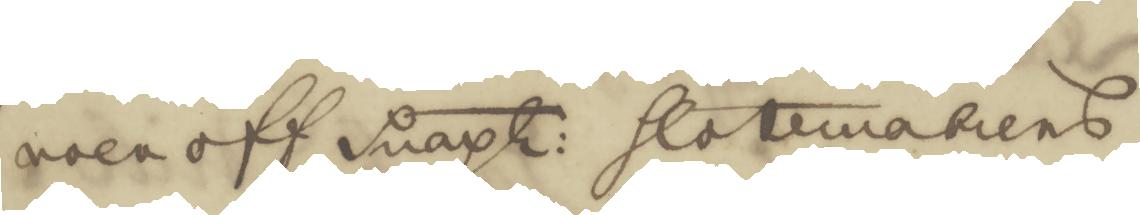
1 voer off snaph: slotemakers
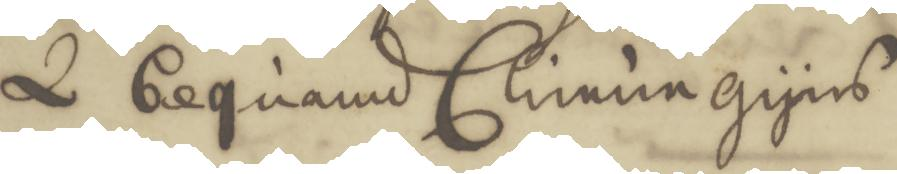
2 bequame Chirurgijns
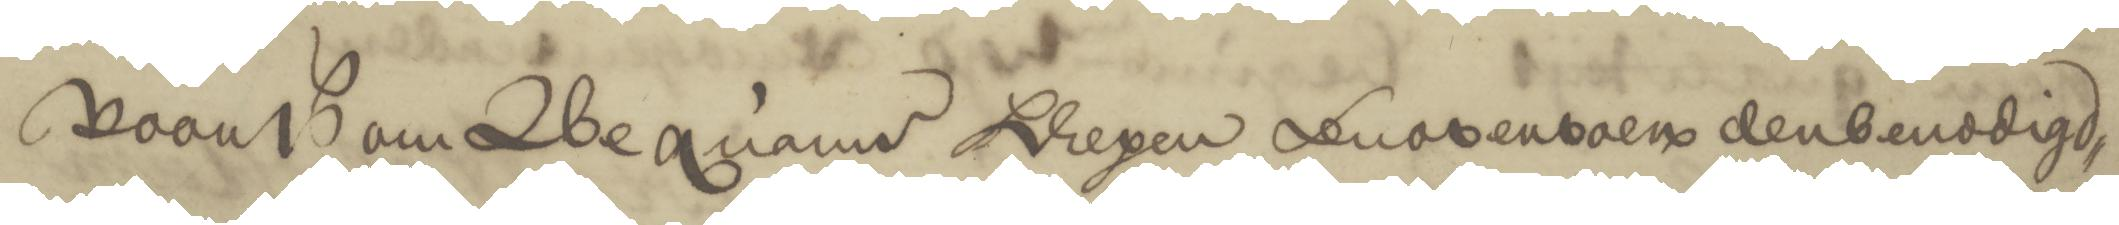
voorts om 2 bequame schepen ten overvoer den benodigd„
